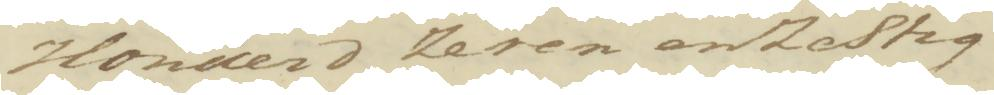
Honderd Zeven en Zestig
